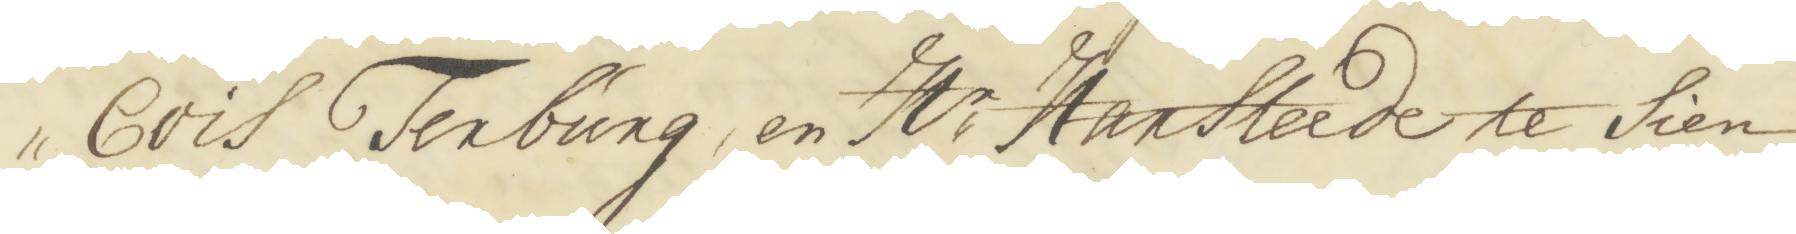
„cois Terburg, en H:r Harsteede te sien
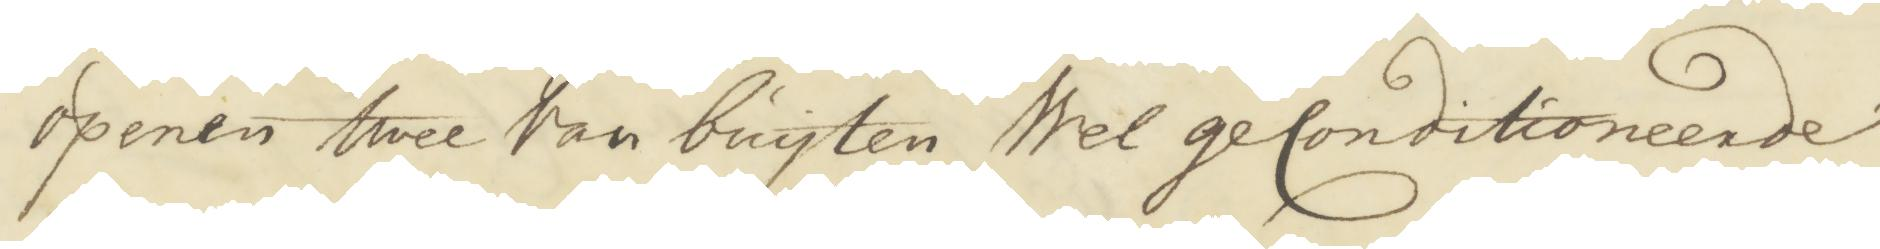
openen twee van buijten wel geconditioneerde
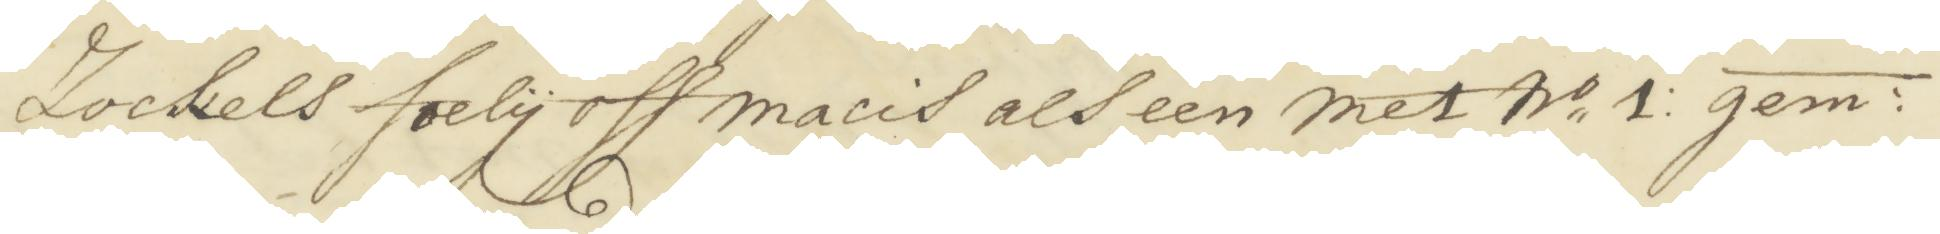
Zockels foelij off macis als een met N„o 1: gem:
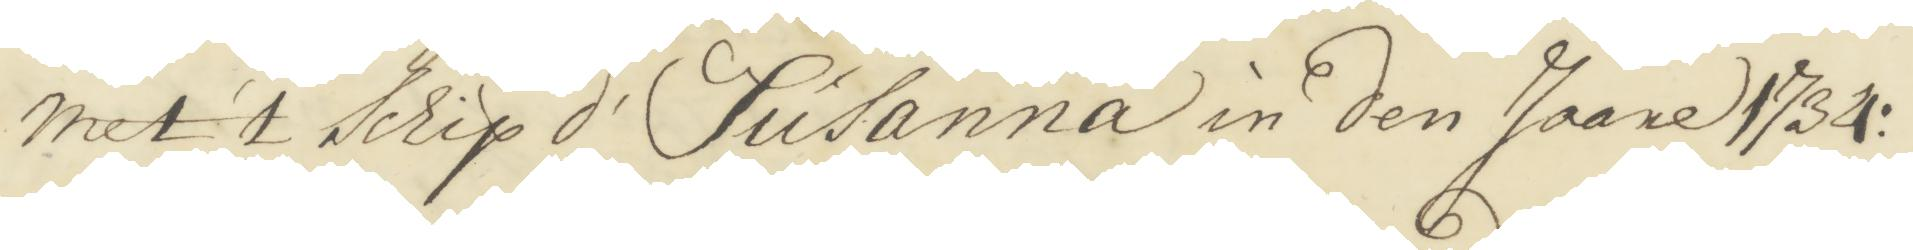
met ’t schip d’ Susanna in den Jaare 1734:
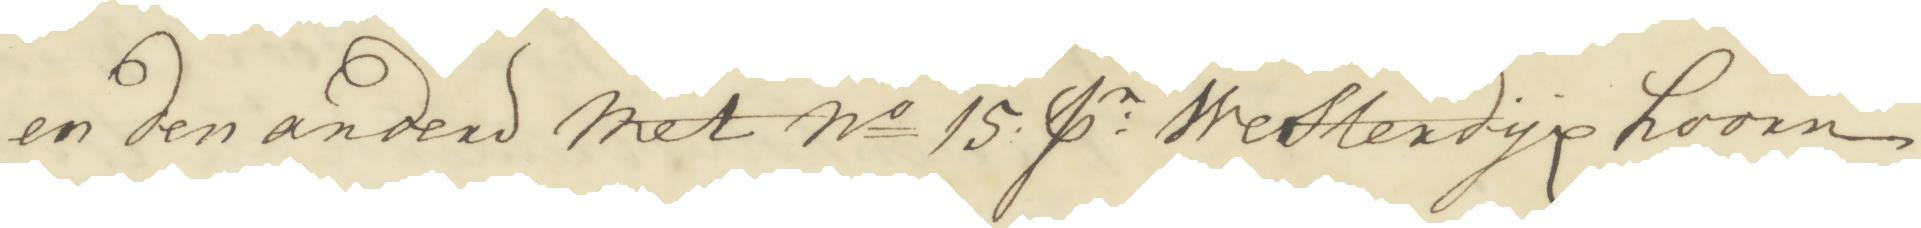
en den andere met n=o 15: p:r Westerdijxhoorn
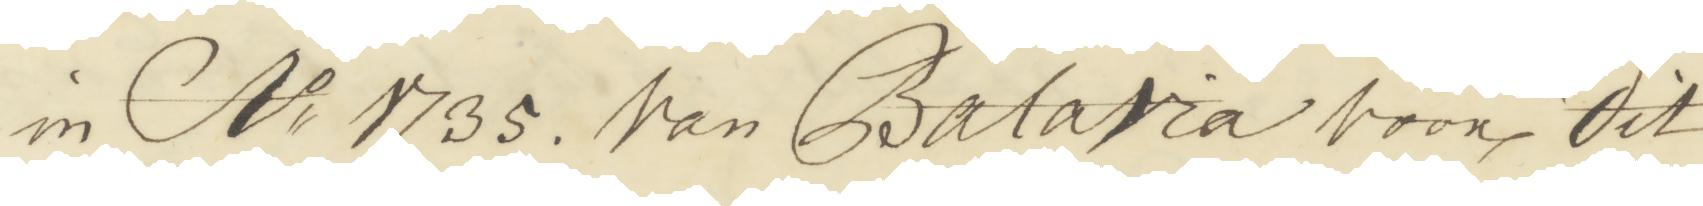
in A„o 1735. van Batavia voor dit
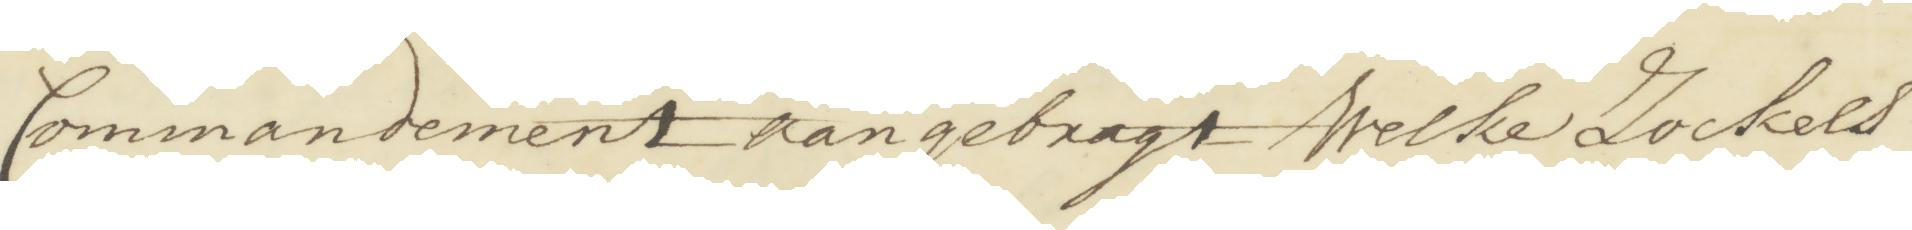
Commandement aan gebragt welke Zockels
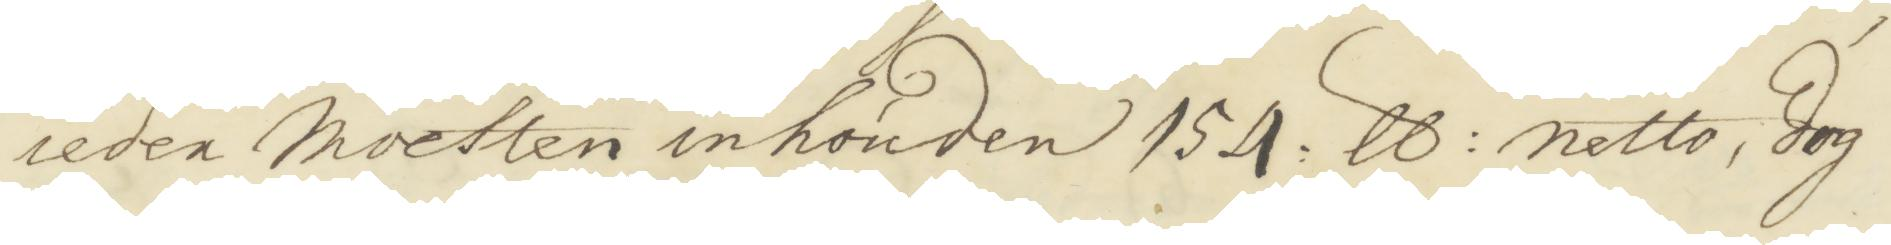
ieder moesten inhouden 154. lb: netto, dog
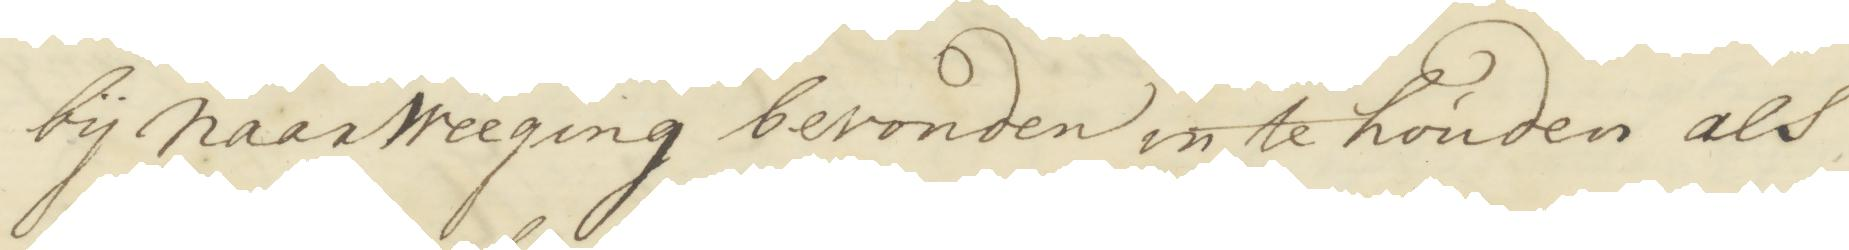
bij naarweeging bevonden in te houden als
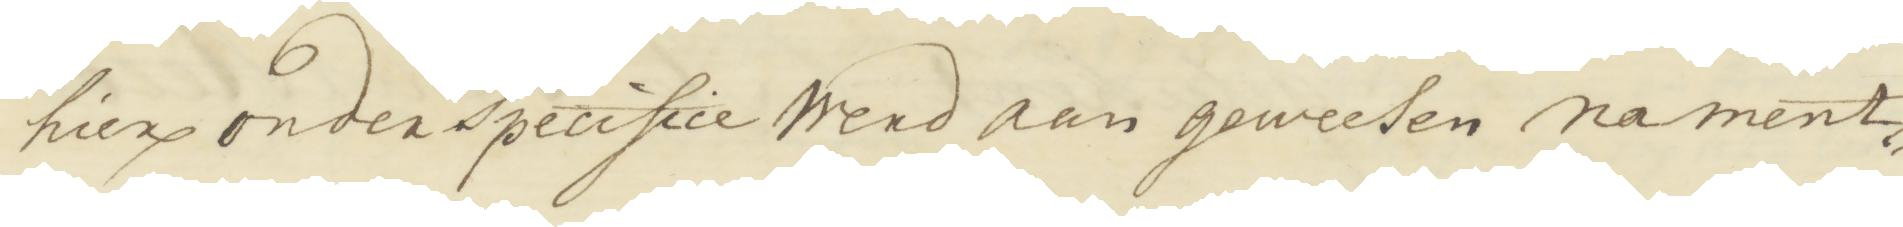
hier onder specifice werd aan geweesen na ment„
